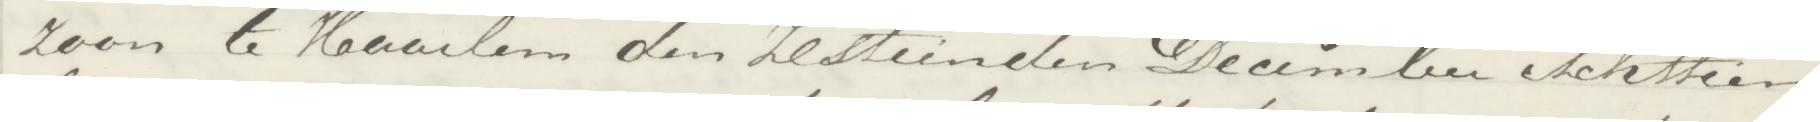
zoon te Haarlem den Zestienden December Achttien
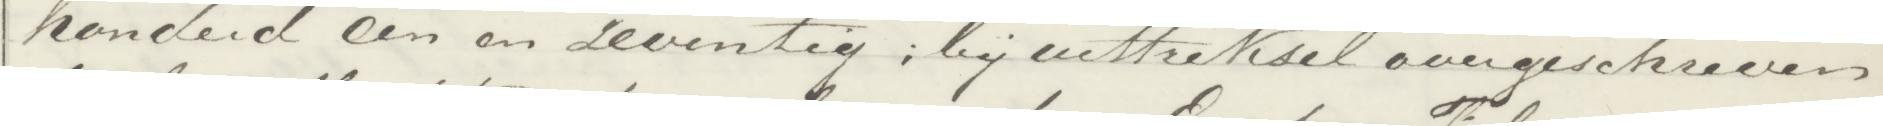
honderd een en zeventig; bij uittreksel overgeschreven
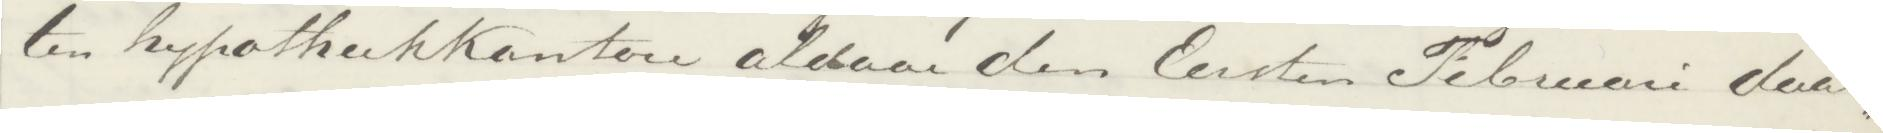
ten hypotheekkantore aldaar den Eersten Februari daar„
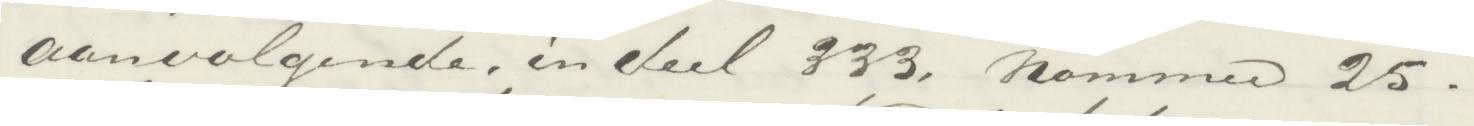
aanvolgende, in deel 333, Nommer 25.
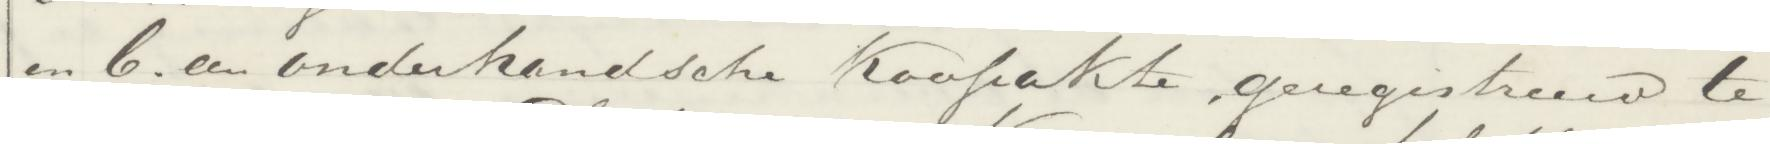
en b. een onderhandsche koopakte, geregistreerd te
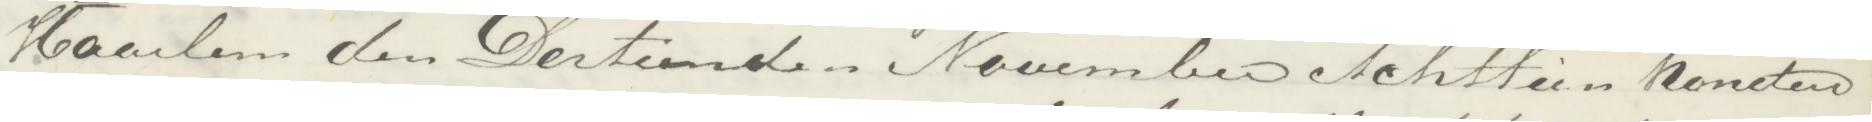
Haarlem den Dertienden November Achttien honderd
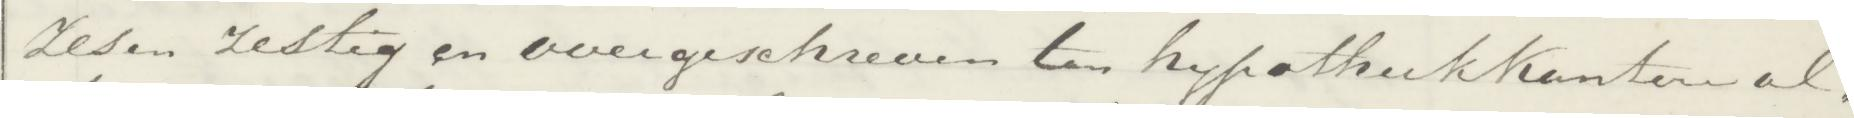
zes en zestig en overgeschreven ten hypotheekkantore al„
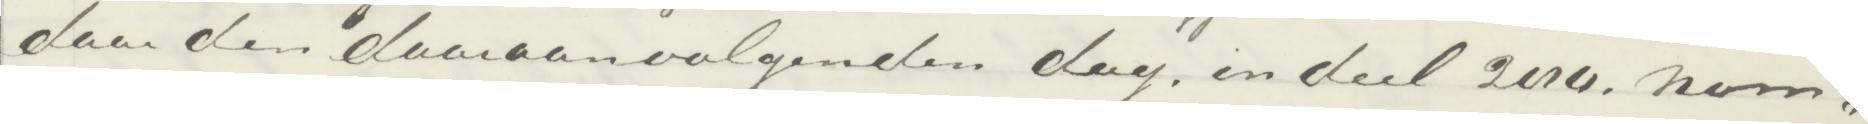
daar den daaraanvolgenden dag, in deel 280. nom„
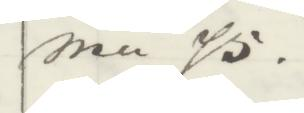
mer 75.
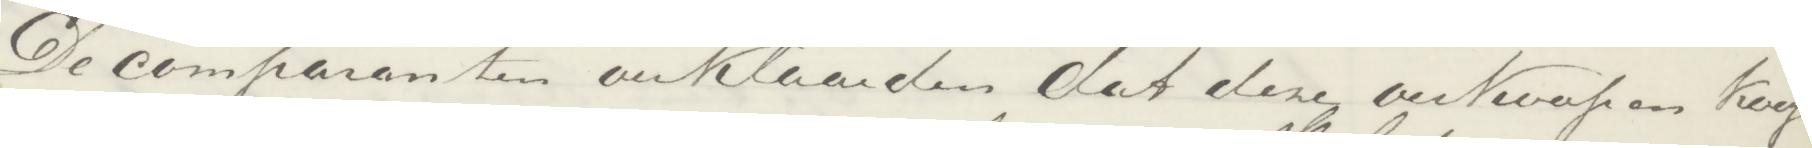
De comparanten verklaarden dat deze verkoop en koop
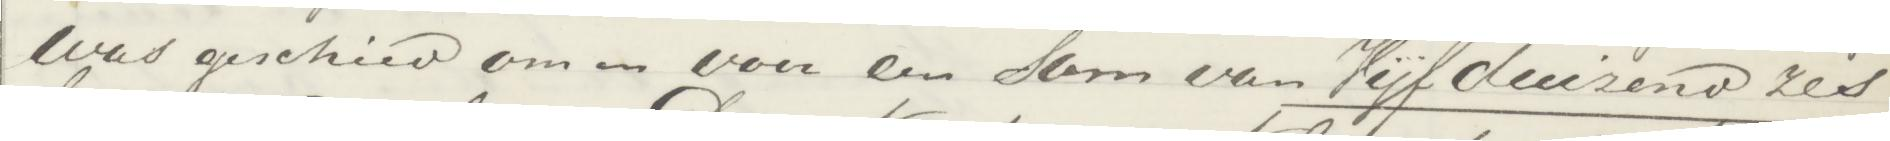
was geschied om en voor een stom van Vijf duizend zes
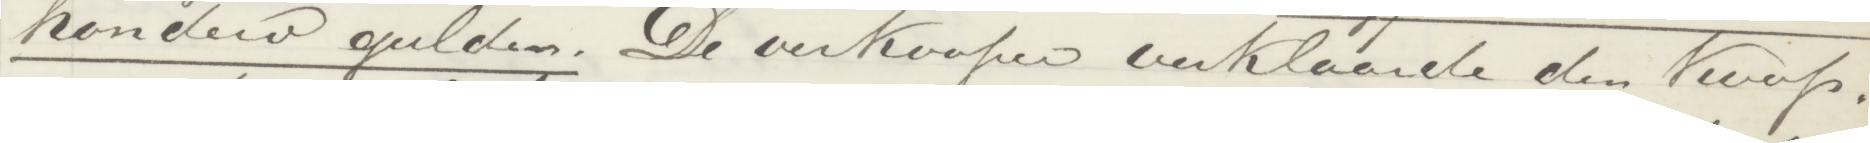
honderd gulden. De verkooper verklaarde den koop
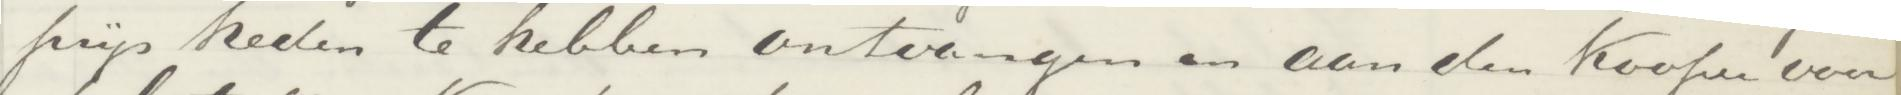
prijs heden te hebben ontvangen en aan den kooper voor
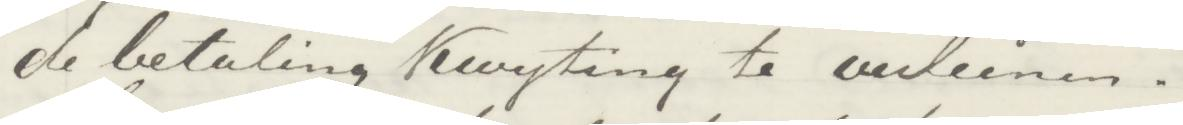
de betaling kwyting te verleenen.
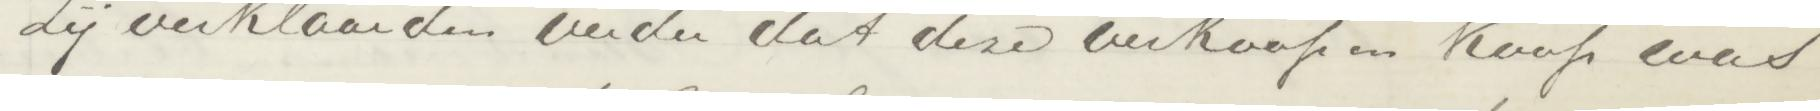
zij verklaarden verder dat deze verkoop en koop was
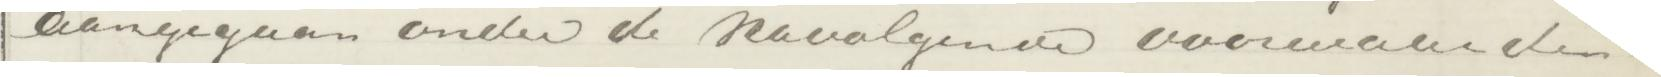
aangegaan onder de navolgende voorwaarden:
